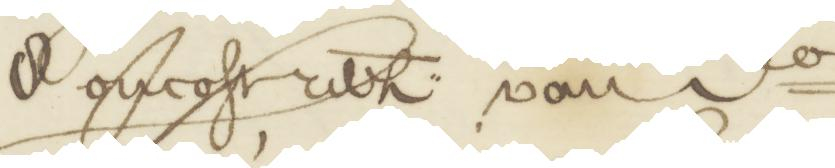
8 oncost reek„ van d=o
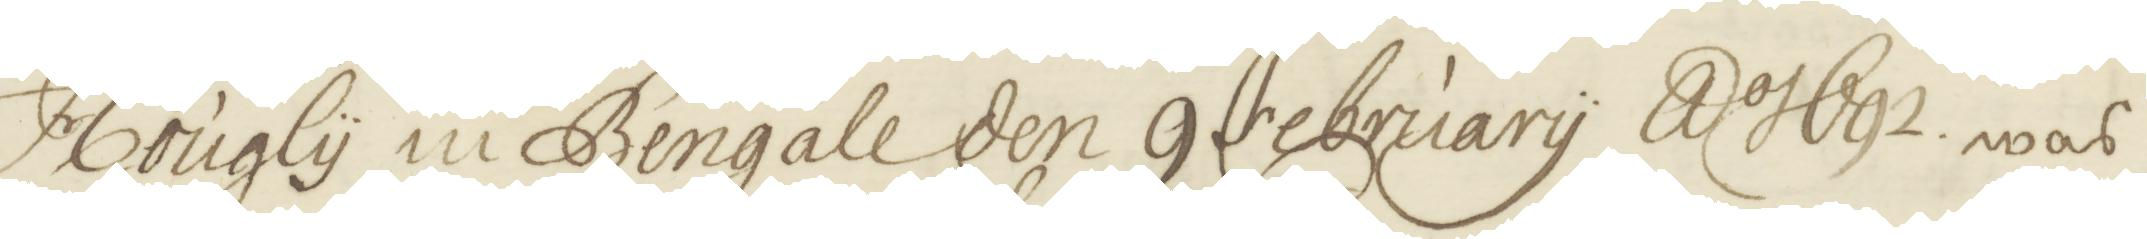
Houglij in Bengale den 9 Febuarij A:o 1692. was
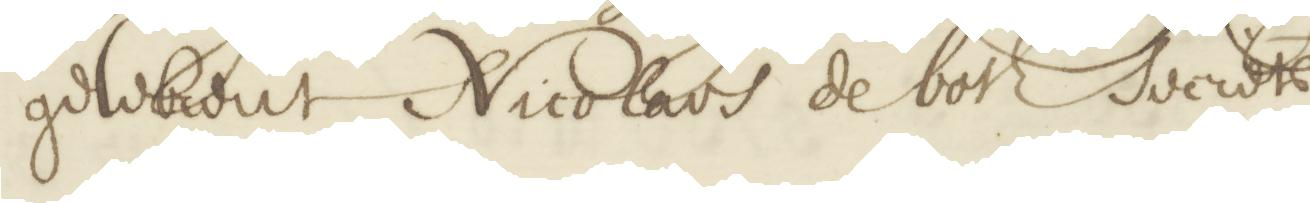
getekent Nicolaes de both Secret:s
